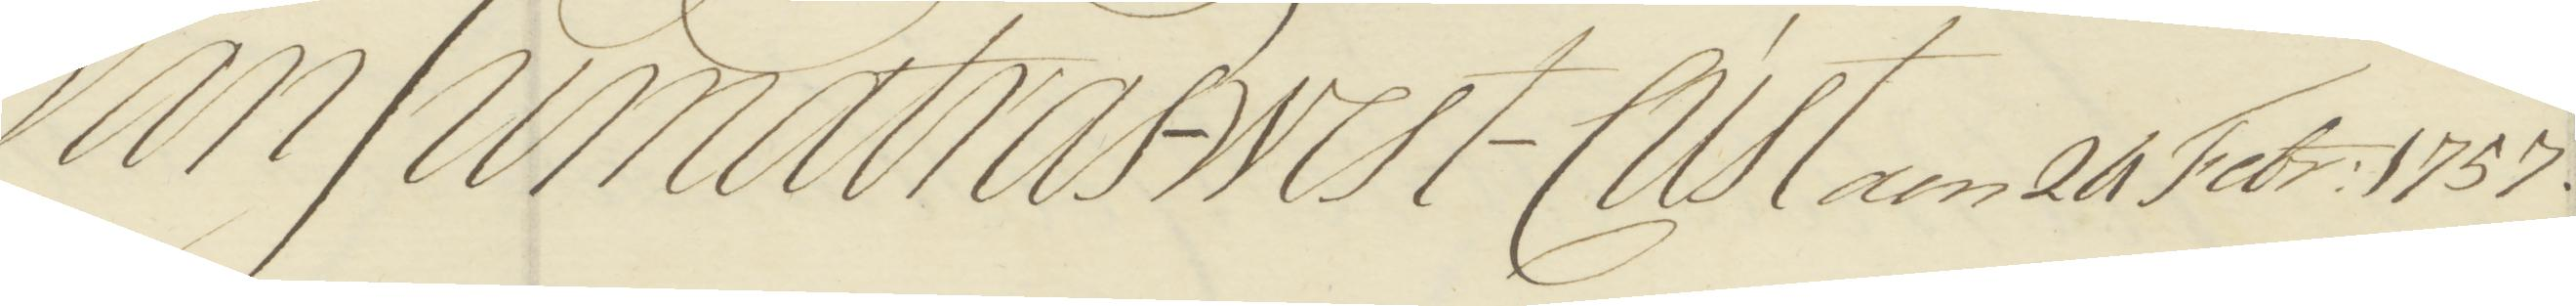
Van Sumatras-west- cust den 24 Febr: 1757.
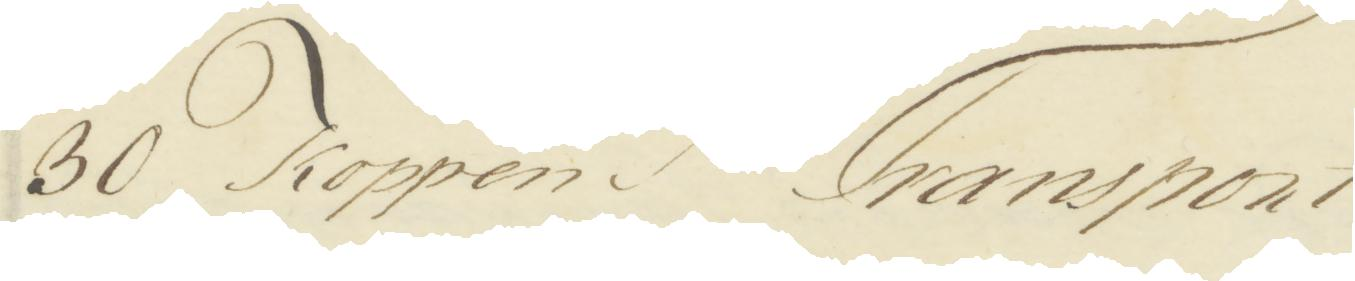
30 koppen P=r Transport
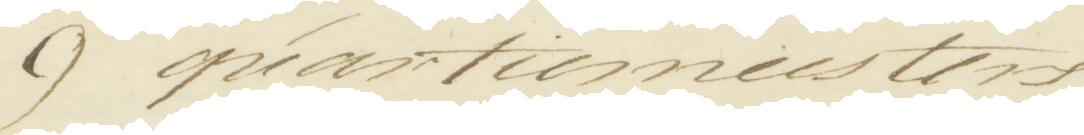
9 quartiemeesters
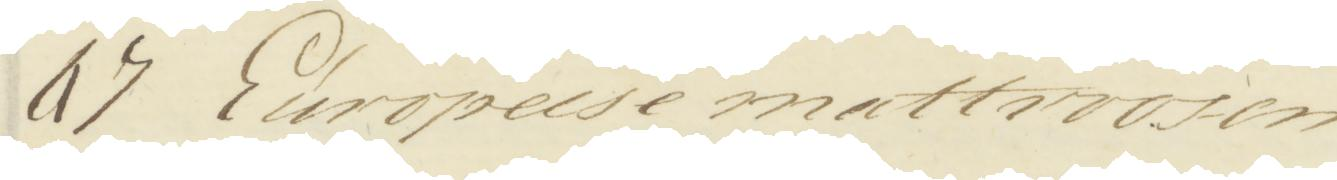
47 Europeese mattroosen
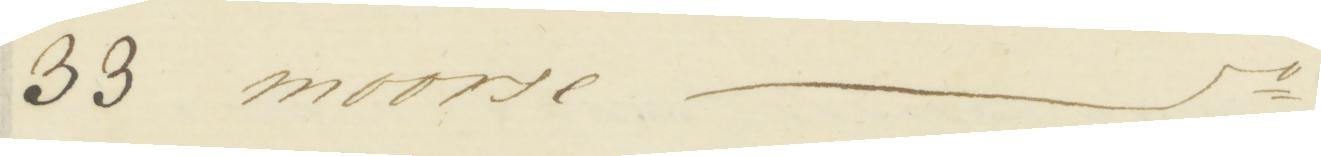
33 moorse _=o
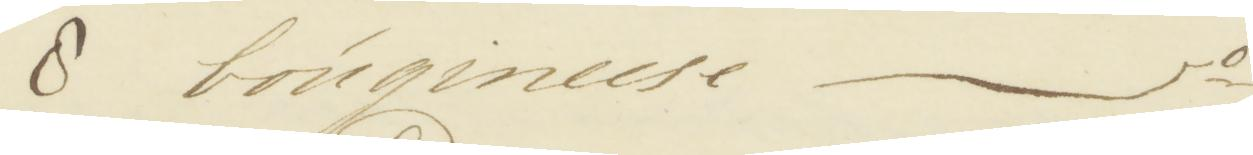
8 bougineese _=o
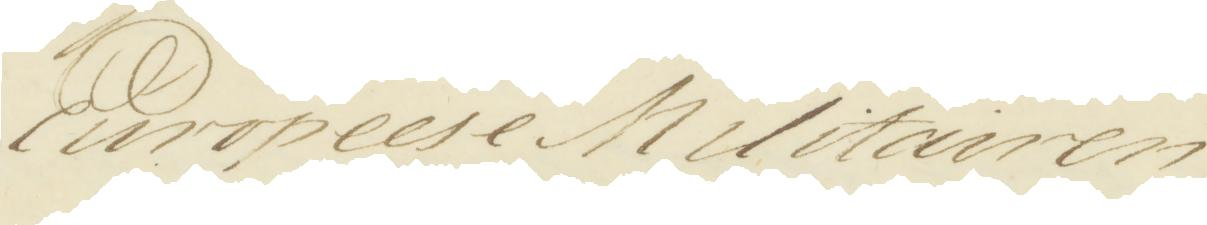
Europeese Militairen
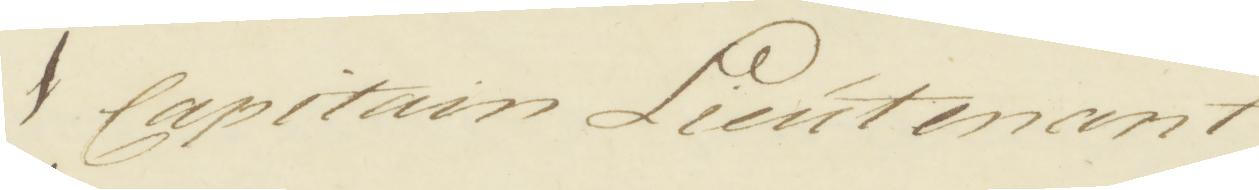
1 Capitain Lieutenant
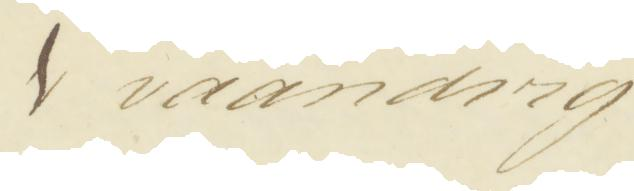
1 vaandrig
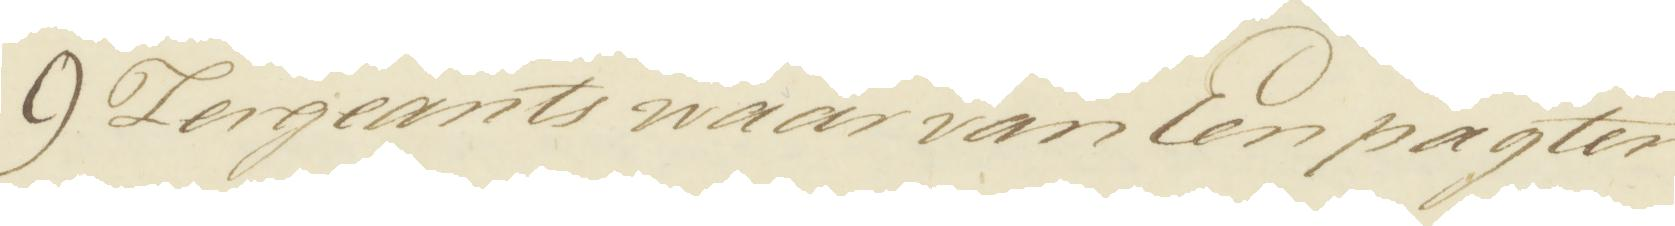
9 Zergeants waar van Een pagter
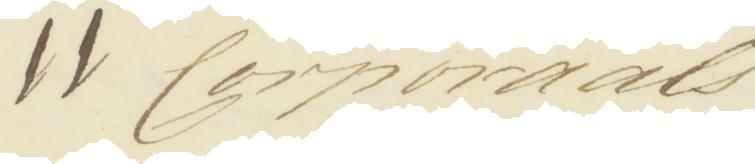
11 Corporaals
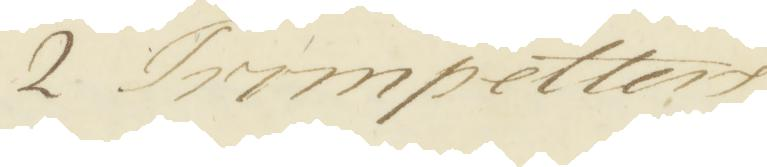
2 Trompetters
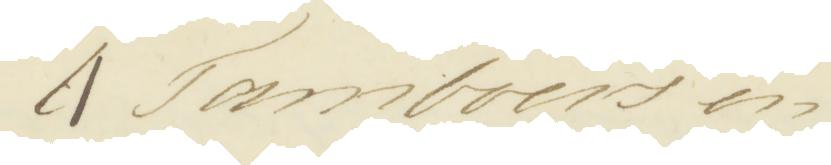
4 Tamboers en
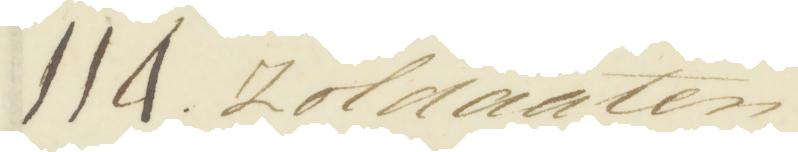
114. zoldaaten
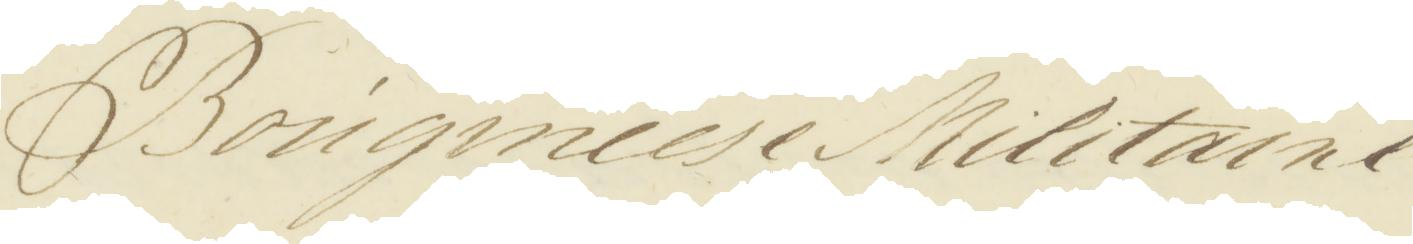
Bougineese Militaire
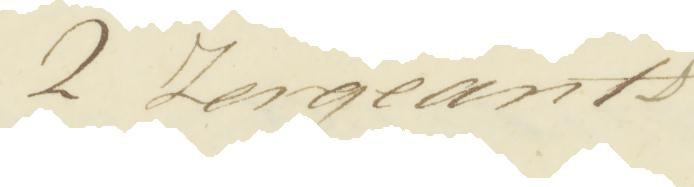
2 zergeants
